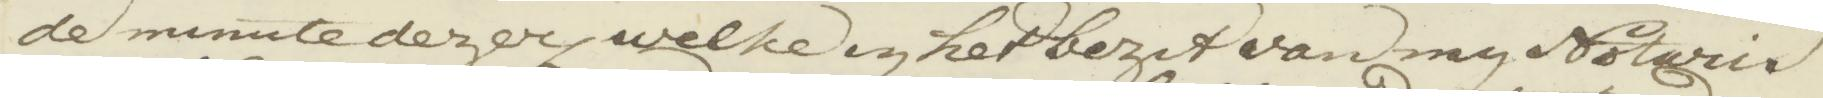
de minute dezer welke in het bezit van my Notaris
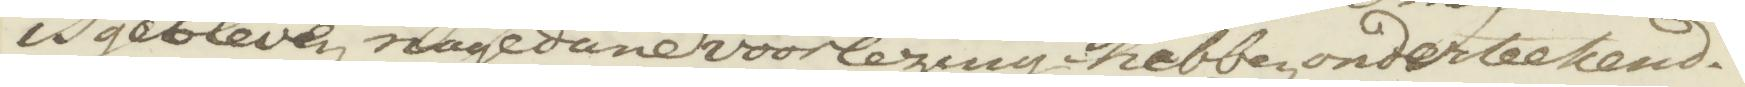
is gebleven nagedane voorlezing hebben onderteekend.
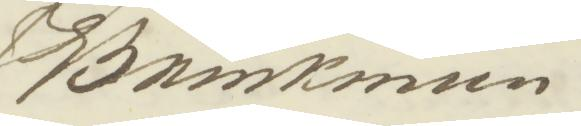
JBrinkman
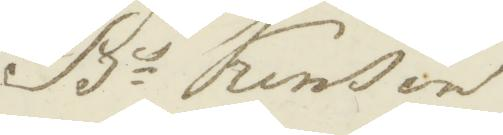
R=s Kinsen
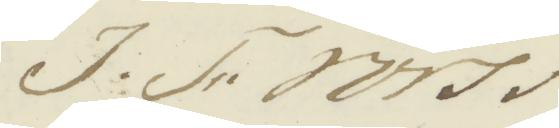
I: F. vorss
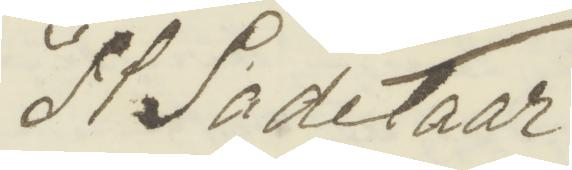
H Sadelaar
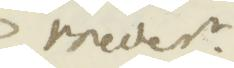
Vreder.r
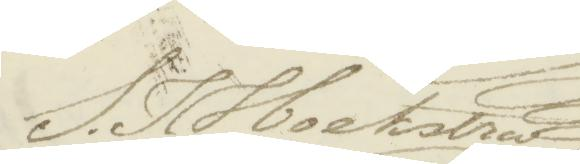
S.S Hoekstra
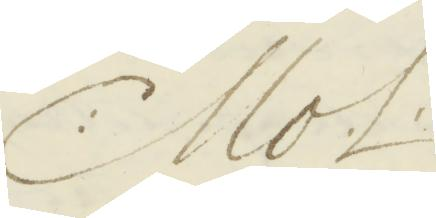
:Mol:
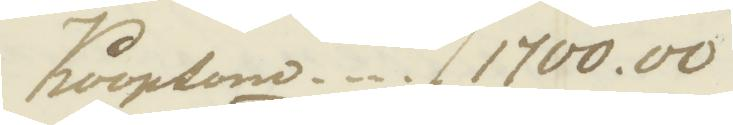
Koopsom- - -. ƒ1700.00
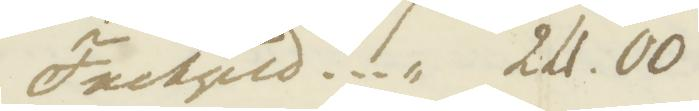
Trekgeld - - - „ 24.00
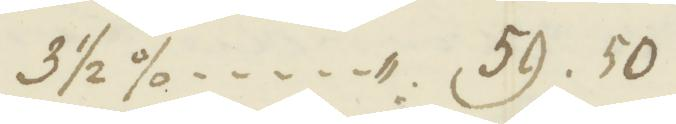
3½ % - - - - -„ . 59.50
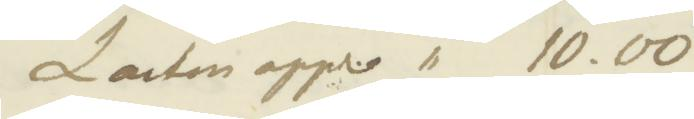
Lasten appr „ 10.00
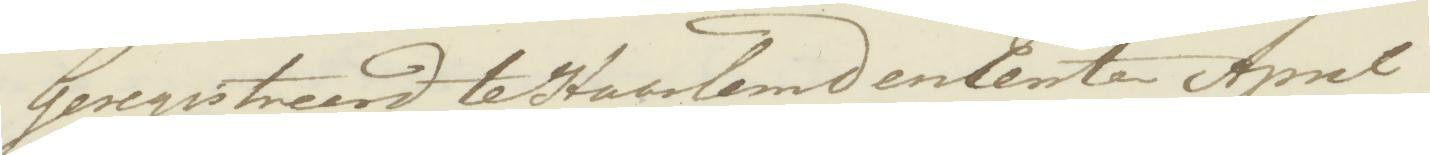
Geregistreerd te Haarlem den Eerste April
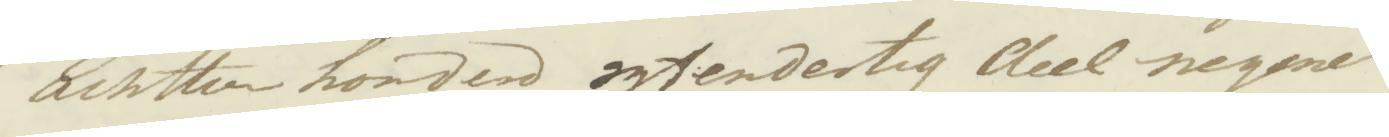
achttien honderd vyfendertig deel negene
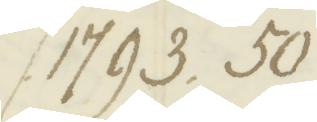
ƒ1793. 50
